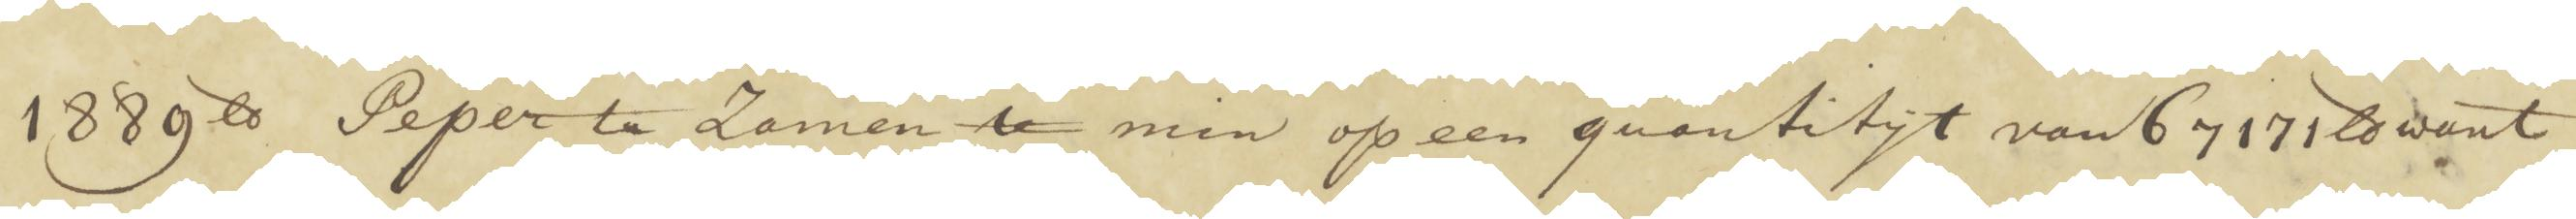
1889 lb Peper te zamen te min op een quantitijt van 67171 lb want
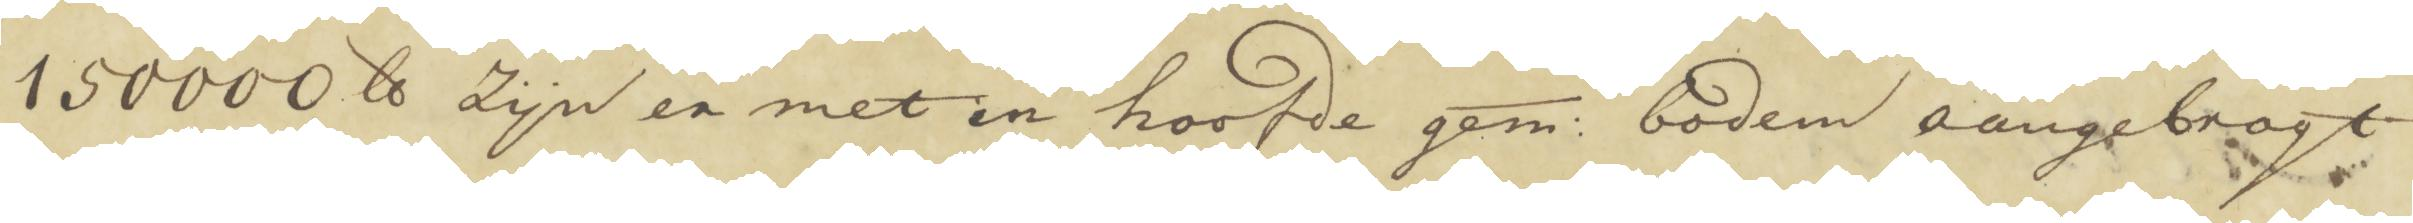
150000 lb zijn er met in hoofde gem: bodem aangebragt
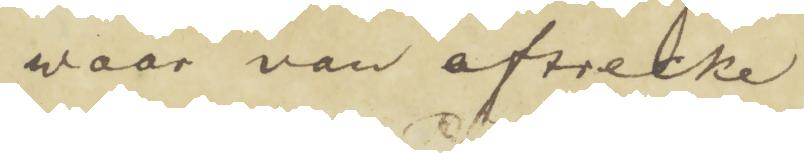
waar van aftrecke
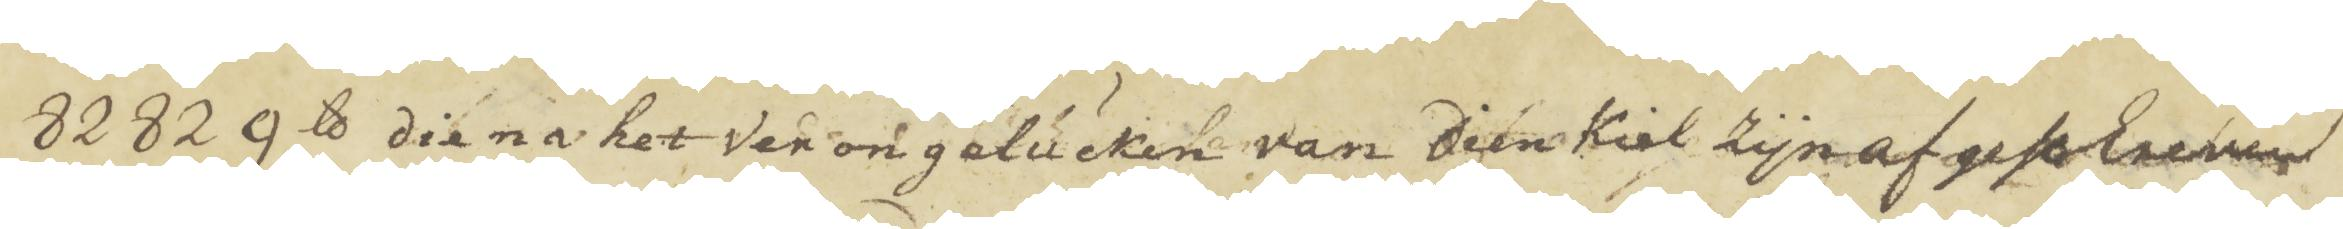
82829 lb die na het verongelucken van dien kiel zijn afgeschreven
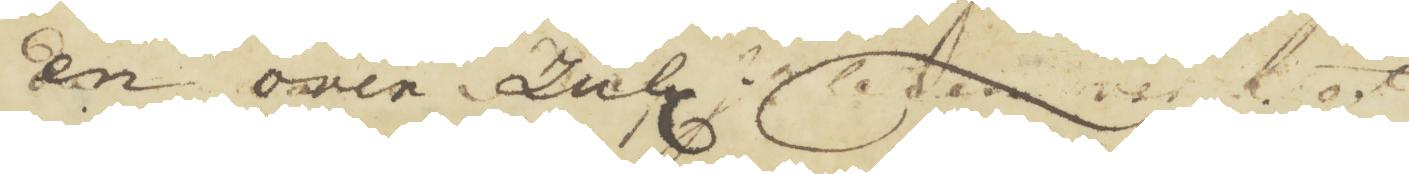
en over zulx
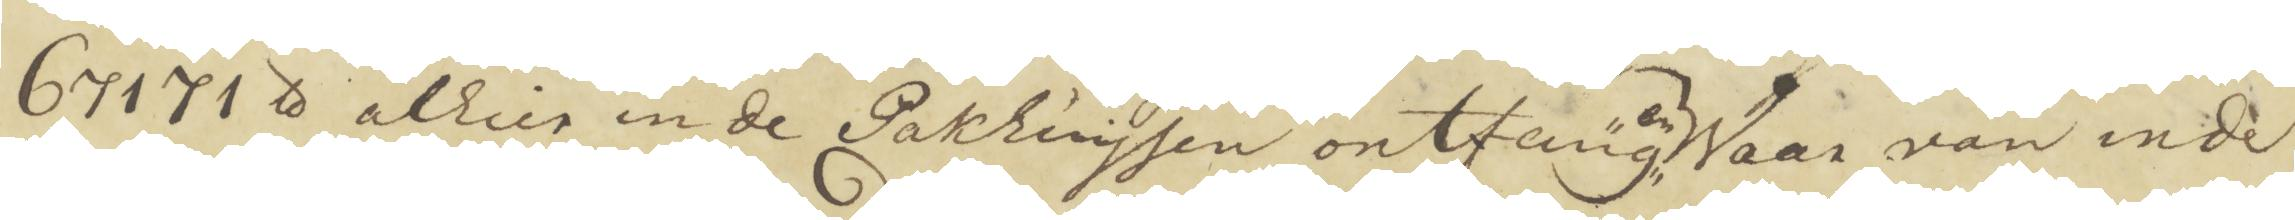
67171 lb alhier in de Pakhuijsen ontfang„ Waar van in de
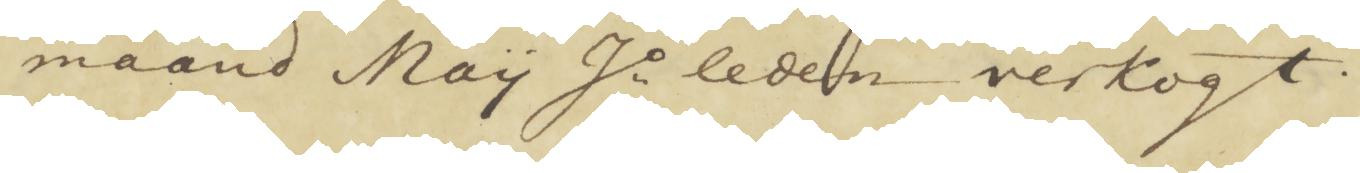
maand Maij J„o leden verkogt.
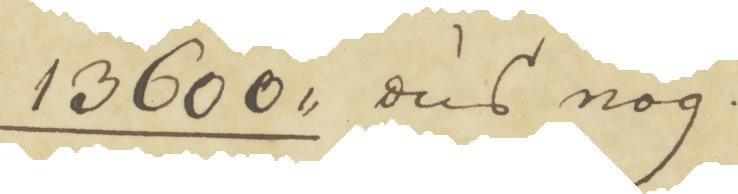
13600 „ dus nog
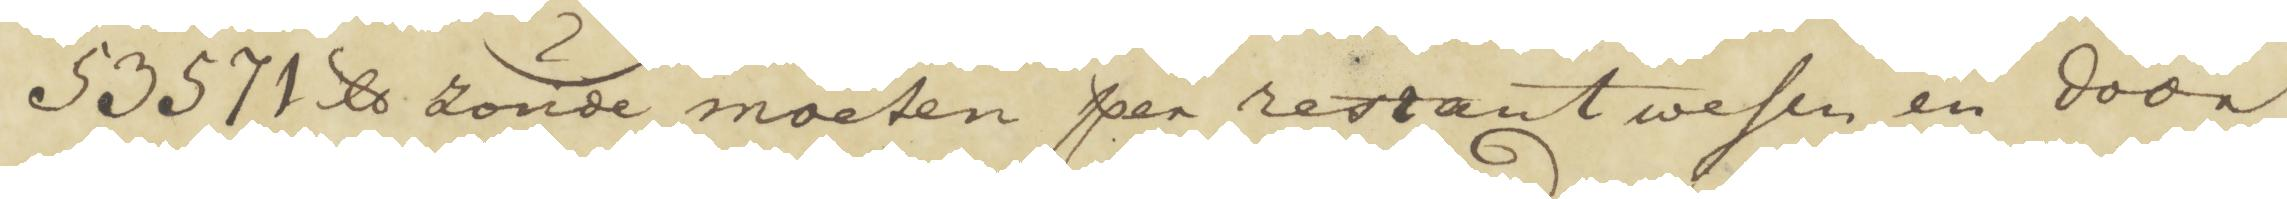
53571 lb zoude moeten per restant wesen en door
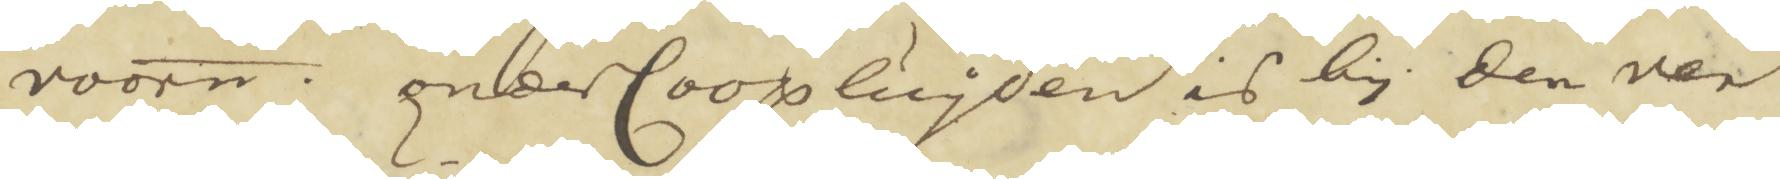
voorn. onder Coopluijden is bij den ver
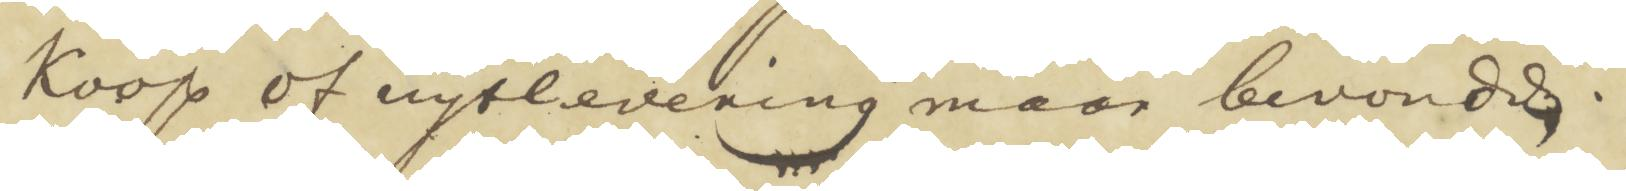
koop of uijtlevering maar bevonden.
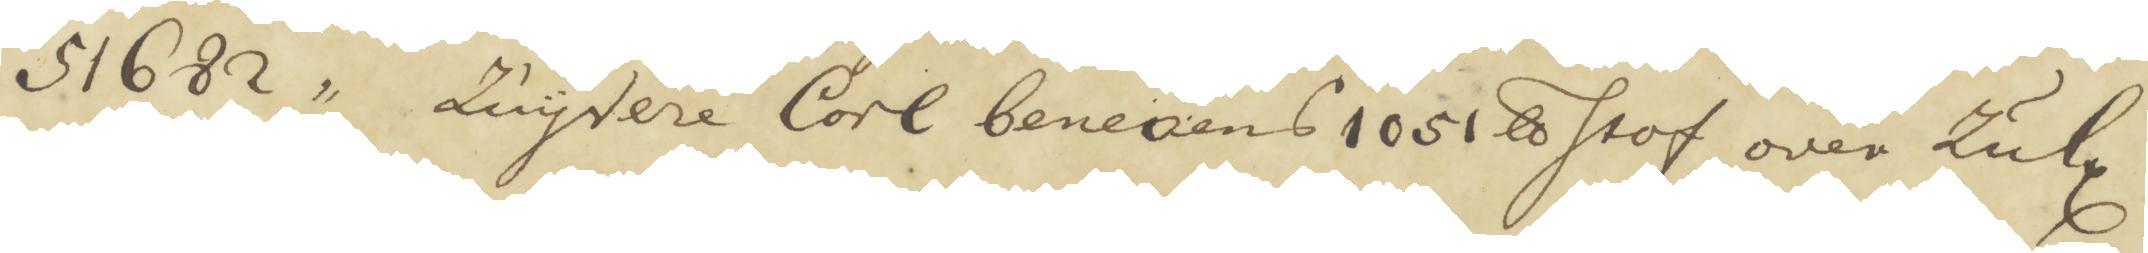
51682 „ zuijvere Corl benevens 1051 lb stof over zulx
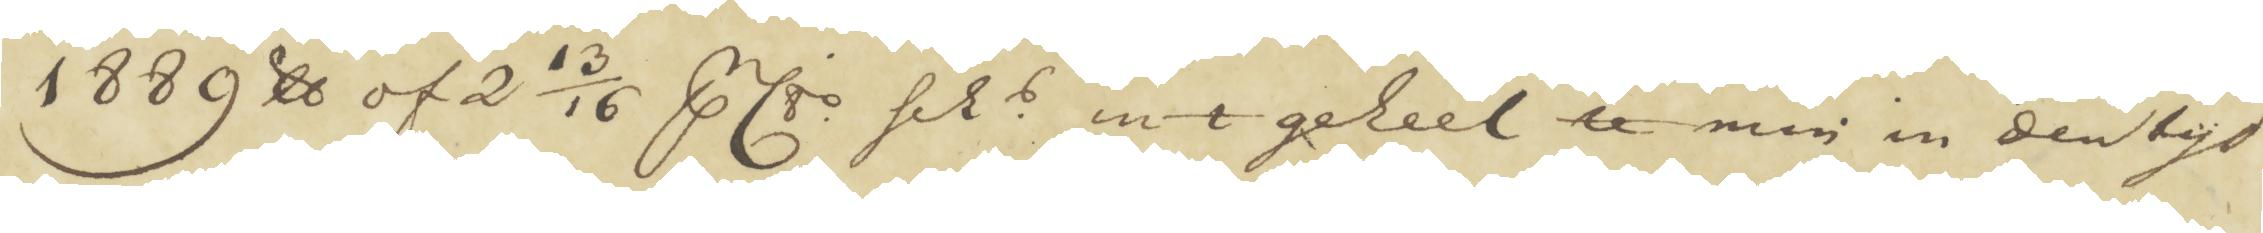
1889 lb of 2 13/16 pr Ct.o sch:s in t geheel te min in den tijd
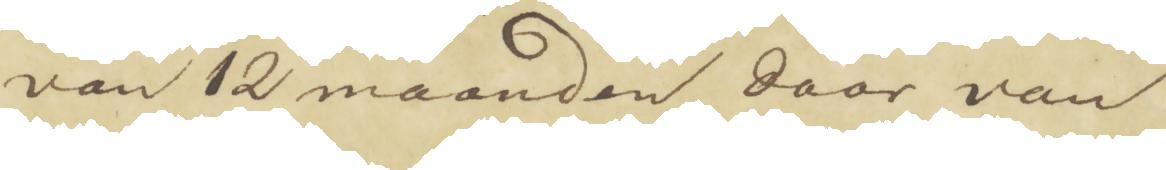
van 12 maanden daar van
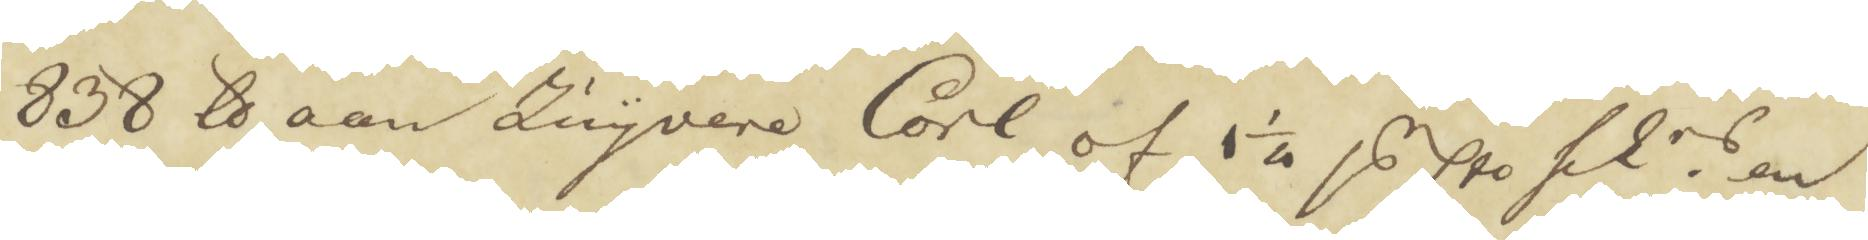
838 lb aan zuijvere Corl of 1¼ pr Cto sch.rs en
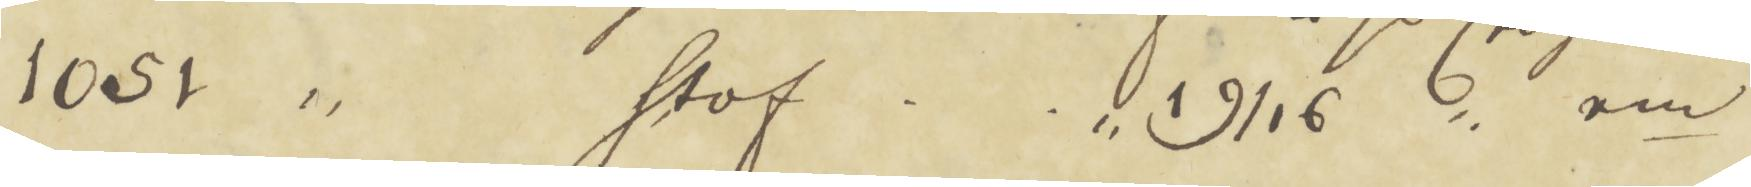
1051 „ stof . . „ 19/16 „ rm
